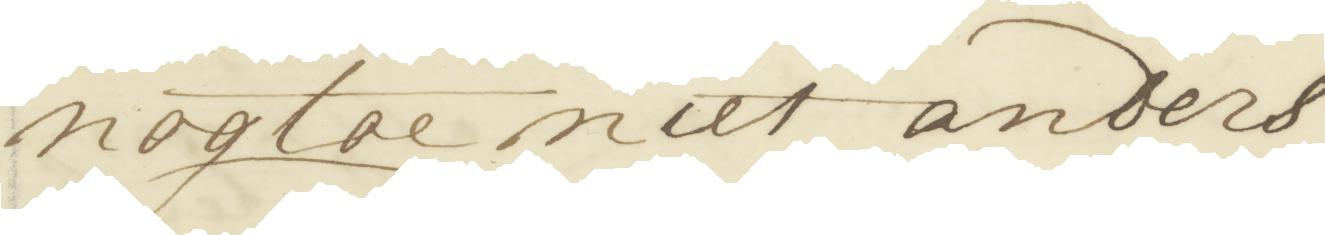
nog toe niet anders
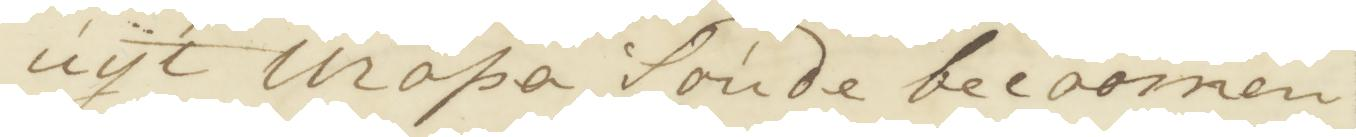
uijt Uropa soude becoomen
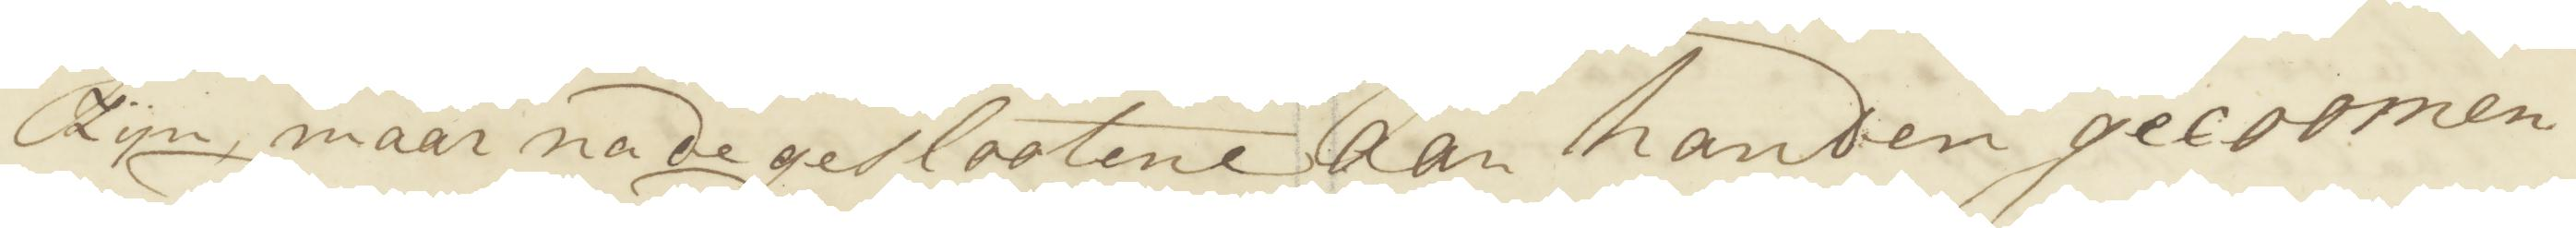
zijn, maar na de geslootene dan handen gecoomen
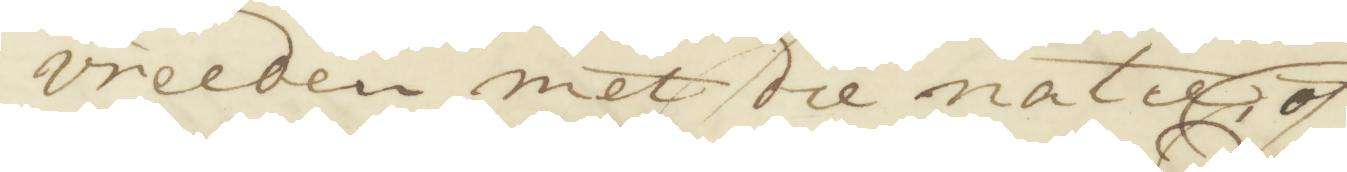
vreeden met die natie, of
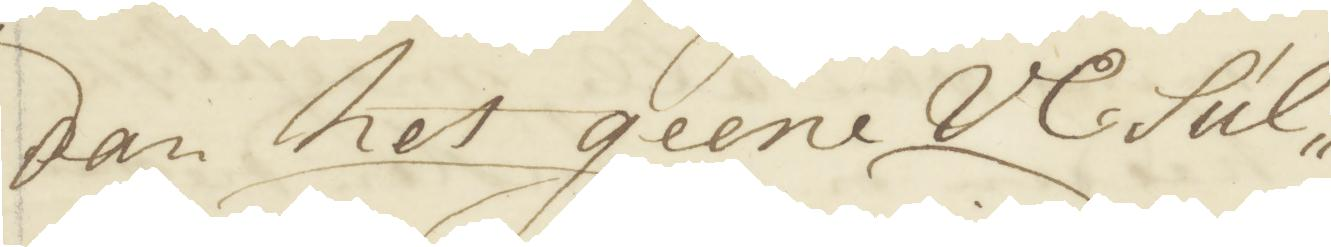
dan het geene UE: sul„
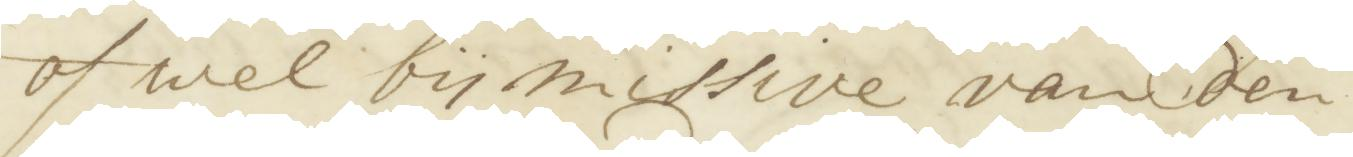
of wel bij missive van den
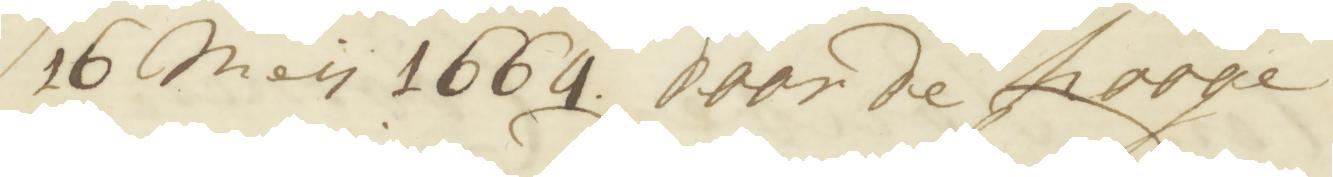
16 meij 1664. door de hooge
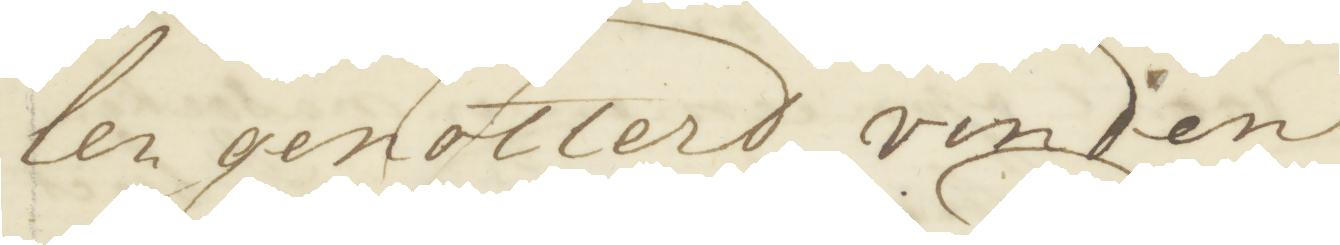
len genotterd vinden
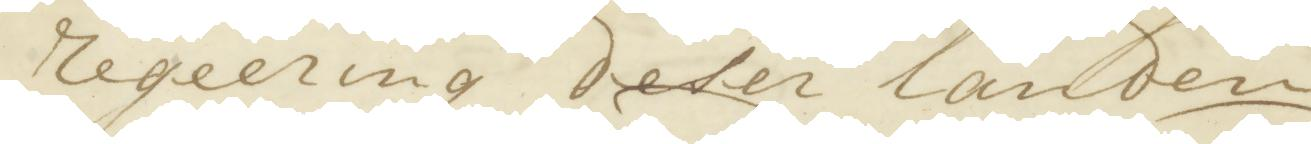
regeering deser landen
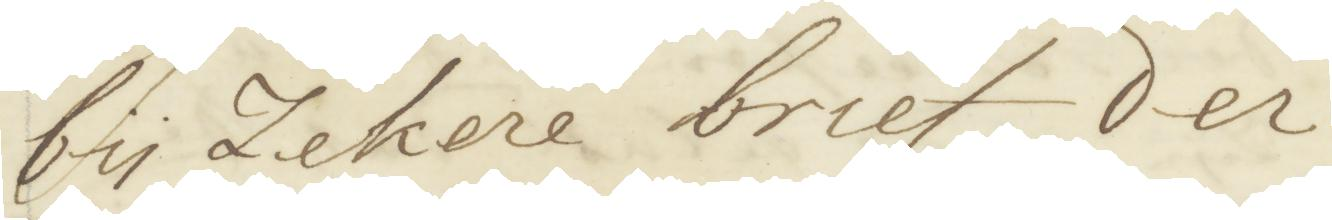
bij zekere brief der
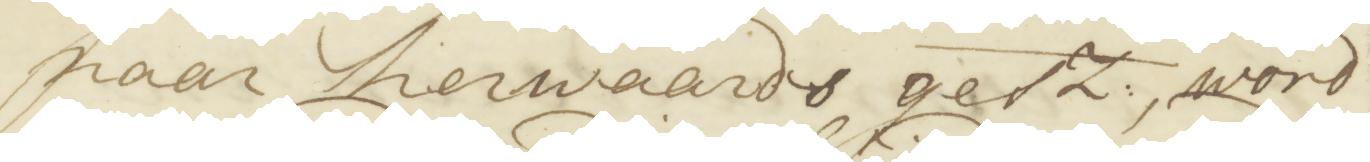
naar herwaards gesz:, word
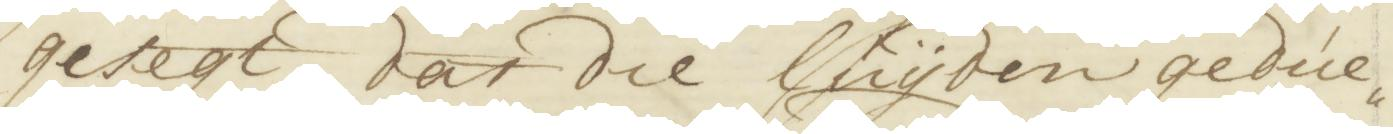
gesegt, dat die luijden gedue„
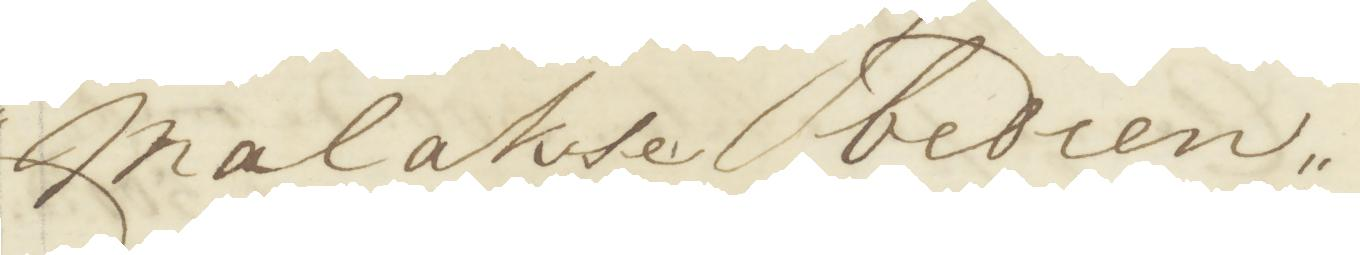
malakse bedien„
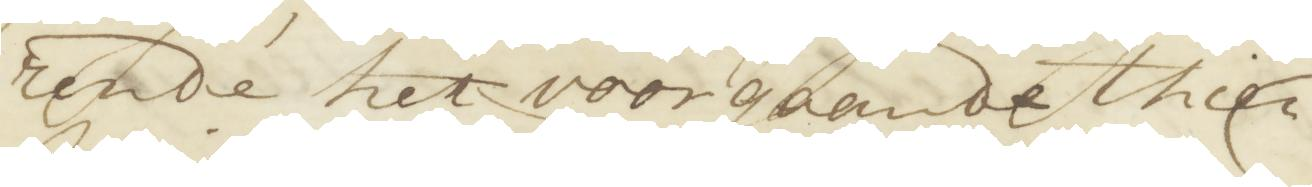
rende het voorgaande thien
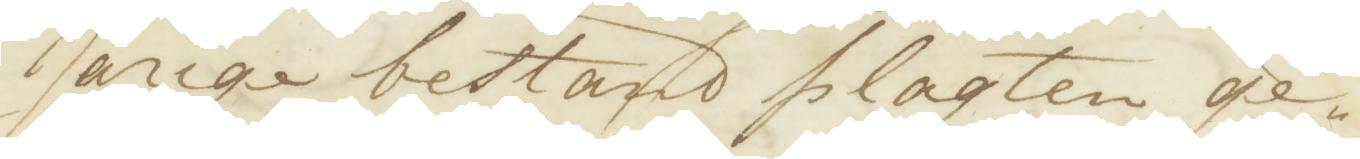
Jarige bestand plagten ge„
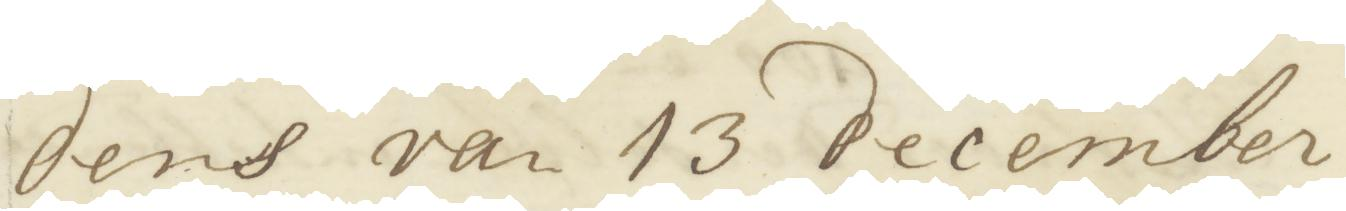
dens van 13 december
